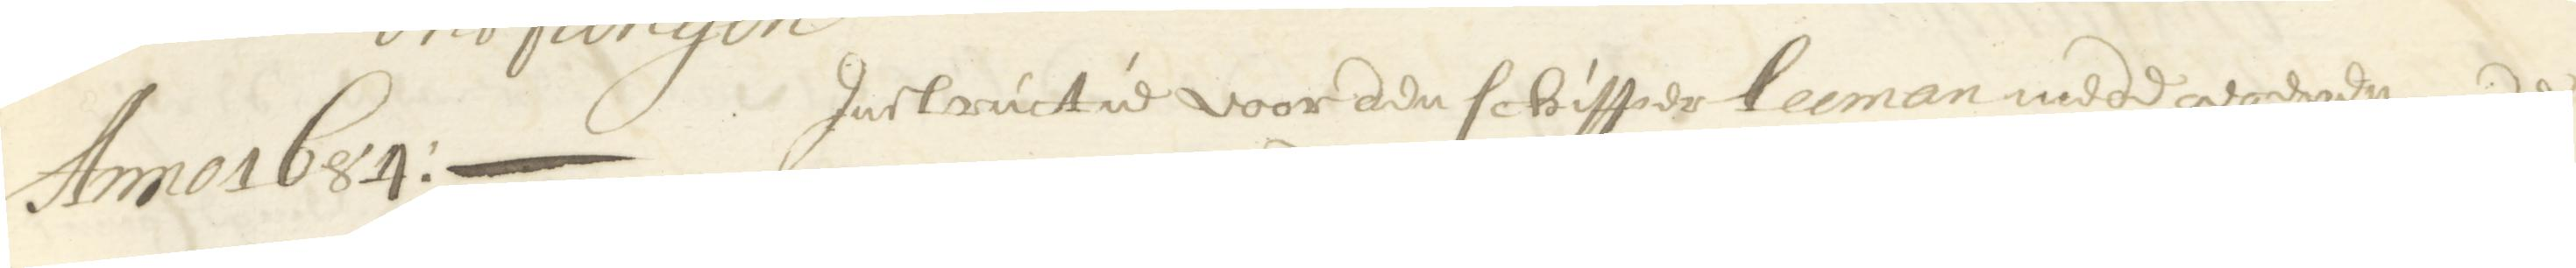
Anno 1684:— Instructie voor den schipper leeman mede gegeven na de
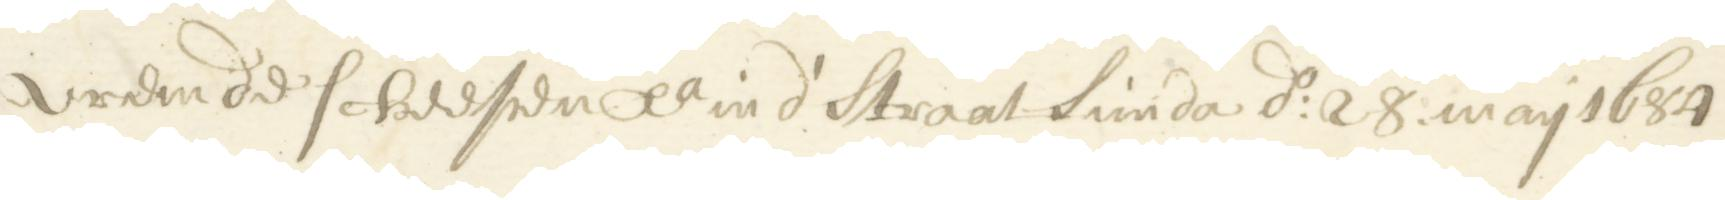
vremde scheepen Aa in d’ straat sunda d:o 28 maij 1684
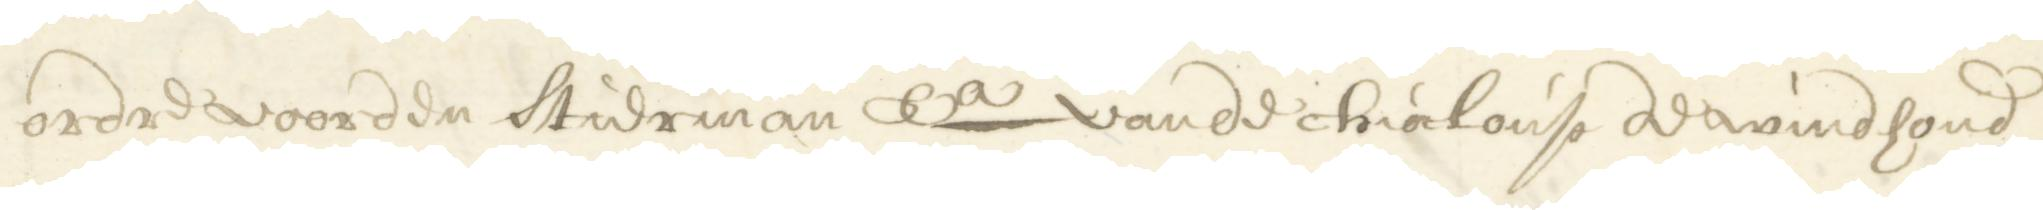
ordre voor den stierman Aa van de chialoup de windhond
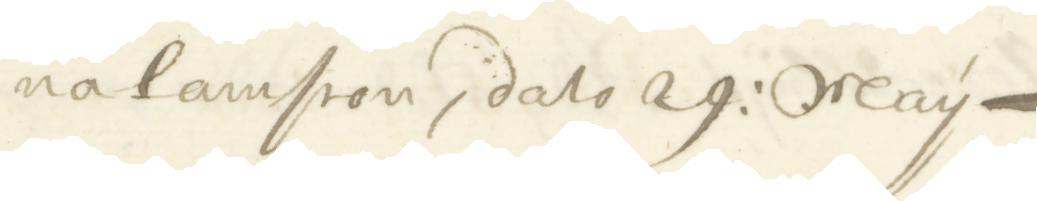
na lampon, dato 29: Maij —
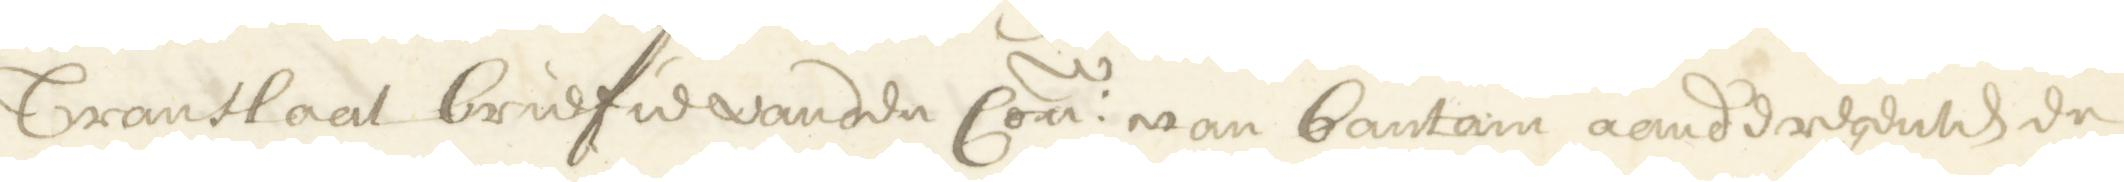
Translaat briefie van den Con: van bantam aan de regenten en
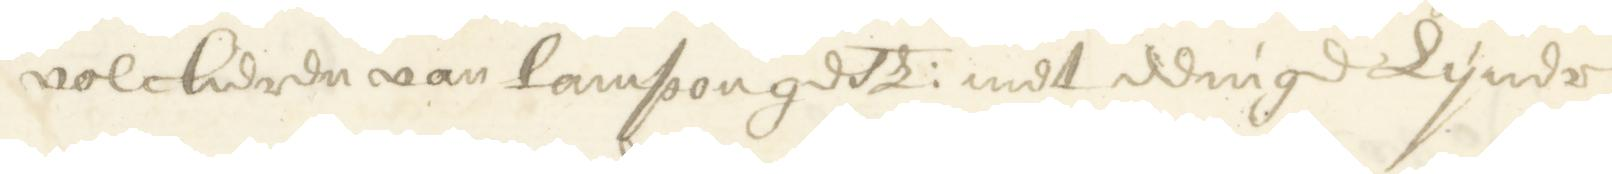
volckeren van Lampon gesz: met eenige zijner
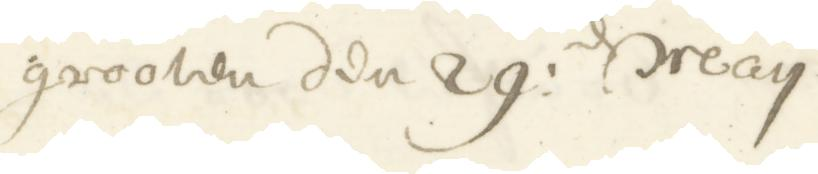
grooten den 29:en Maij
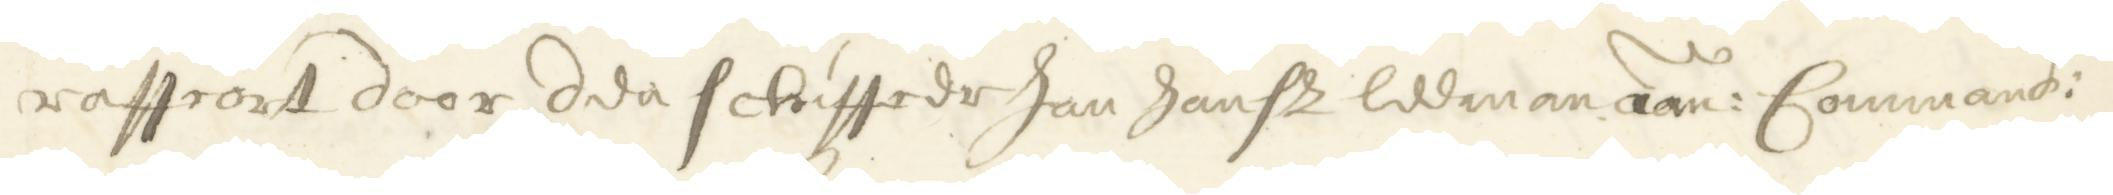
rapprort door der schipper Jan Jansen leeman aan: Command:
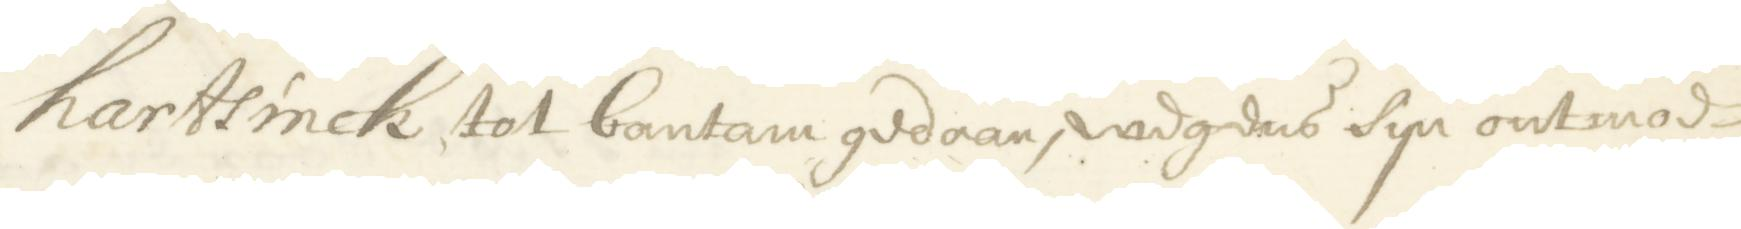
hartsinck tot bantam gedaan, wegens sijn ontmoe=
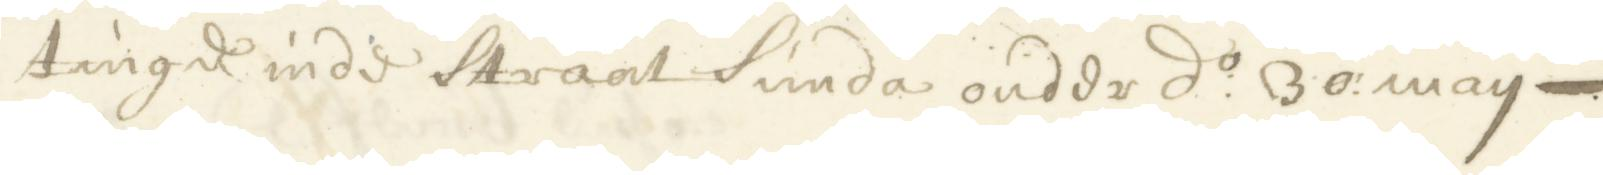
tinge inde straat sunda onder d:o 30: maij —
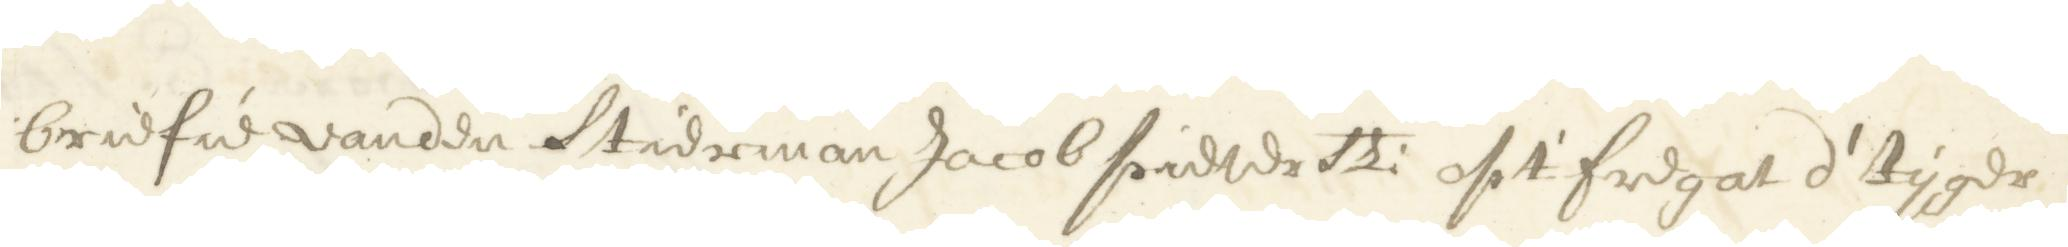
briefie vanden stierman Jacob pietersz: op t' fregat d’tijger
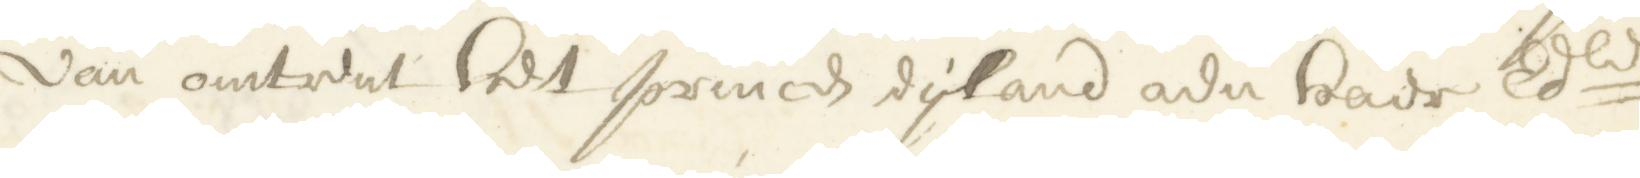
van omtrent het princen eijland aen haer Ed=le
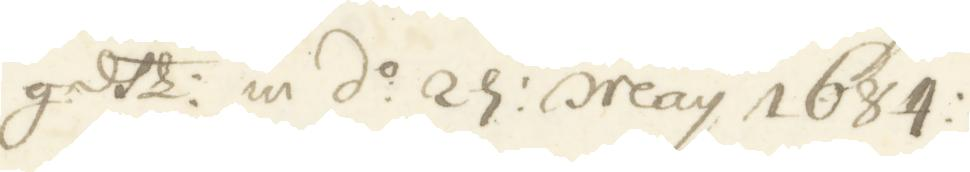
gesz: in d:o 27: Maij 1684:
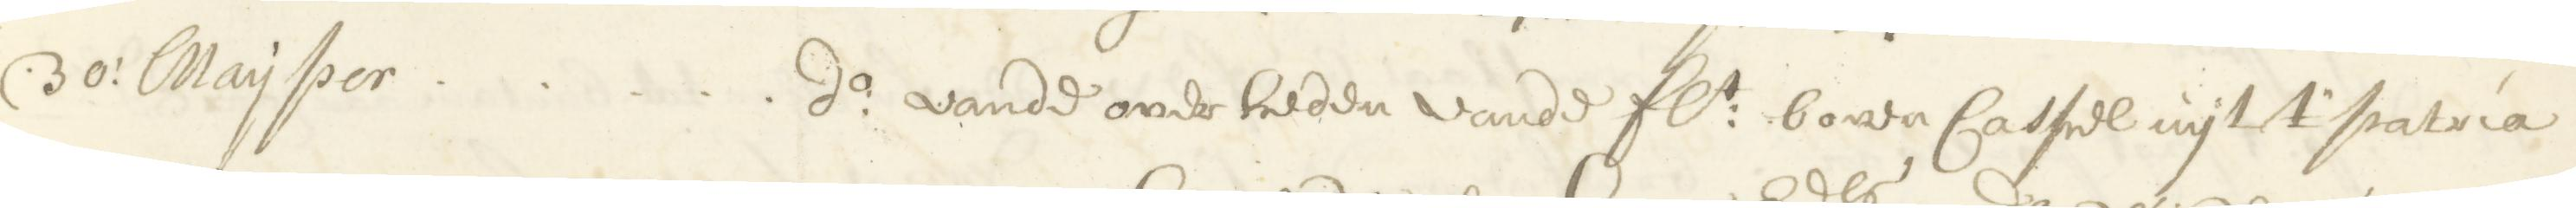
30: Maij per . . . . . d:o vande over heden vande fl:t boven Cassel uijt t' patria
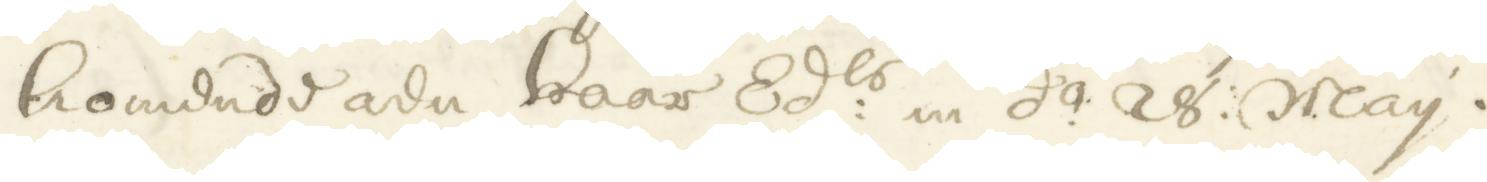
komende aen haar Ed:ls in d:o 28: Maij.
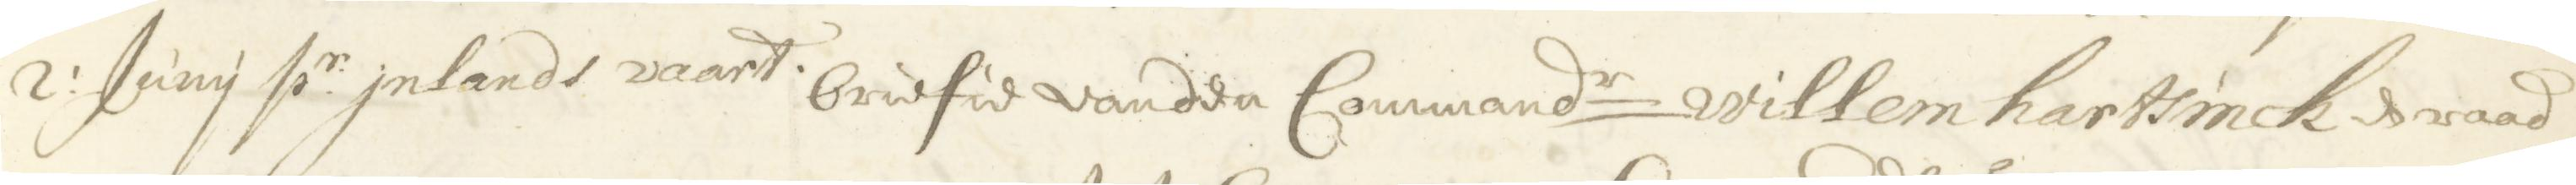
2: Junij p:r jnlands vaart. briefie van den Command=r willem hartsincken raad
